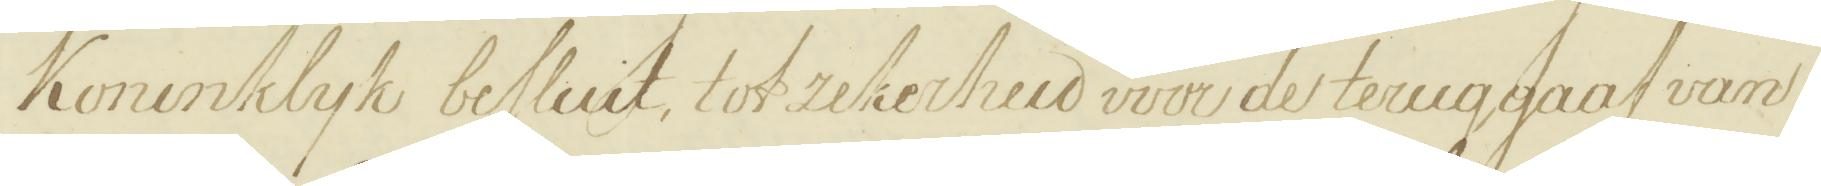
Koninklyk besluit, tot zekerheid voor de teruggaaf van
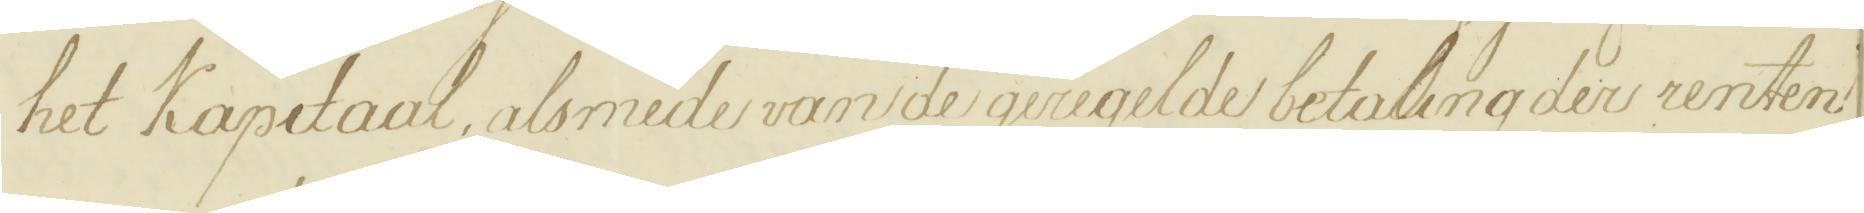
het Kapitaal, alsmede van de geregelde betaling der renten
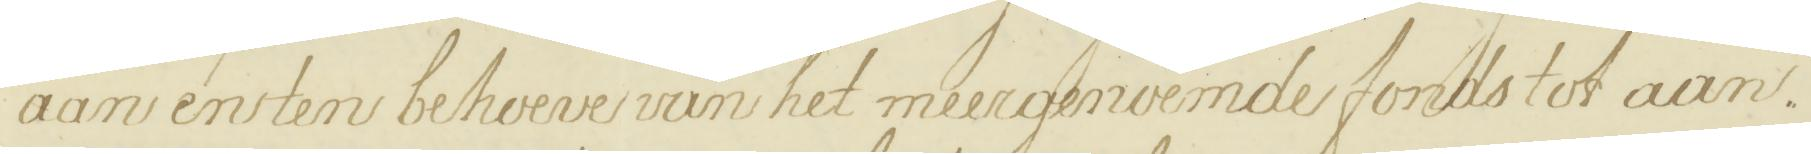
aan en ten behoeve van het meergenoemde fonds tot aan„
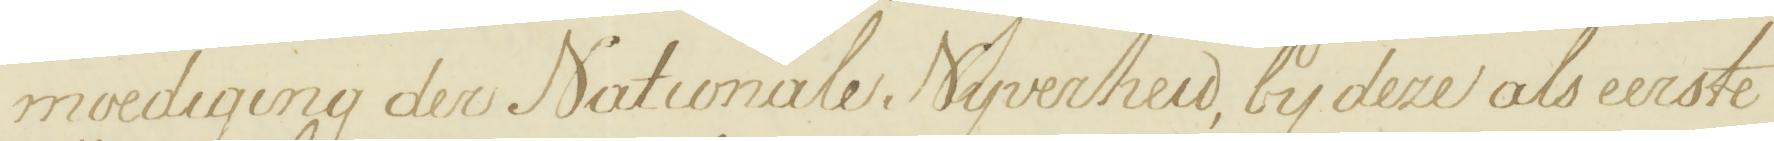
moediging der Nationale Nyverheid, by deze als eerste
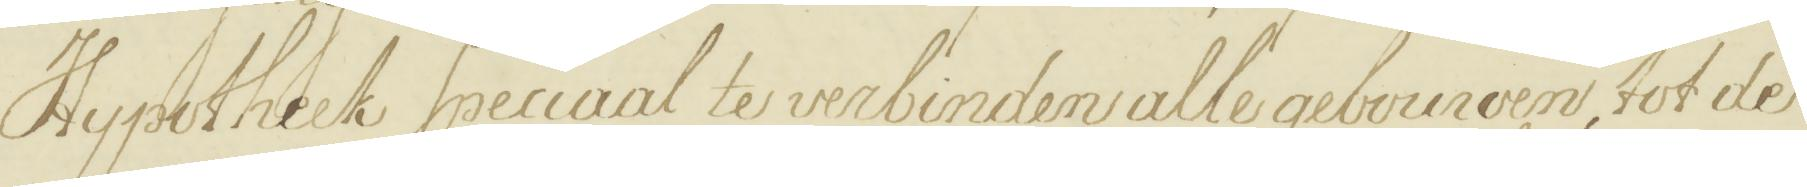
Hypotheek speciaal te verbinden alle gebouwen, tot de
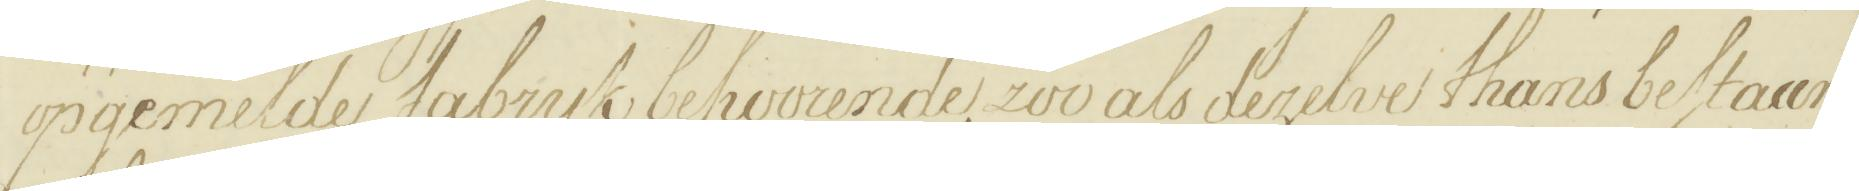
op gemelde fabryk behoorende zoo als dezelve thans bestaan
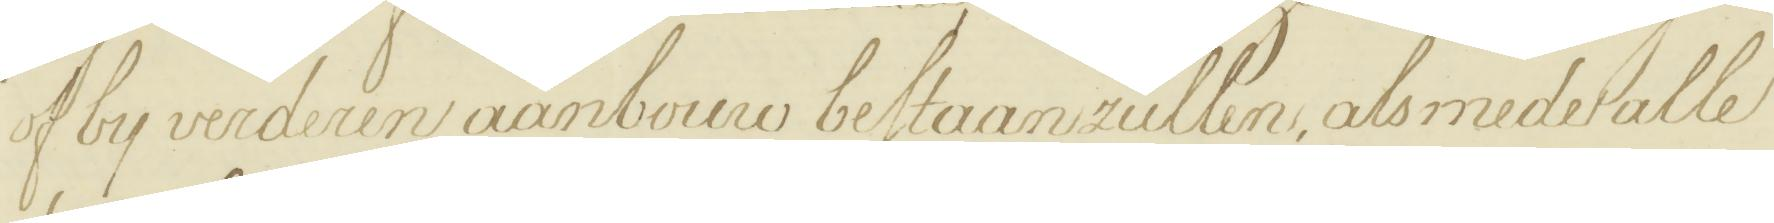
of by verderen aanbouw bestaan zullen, als mede alle
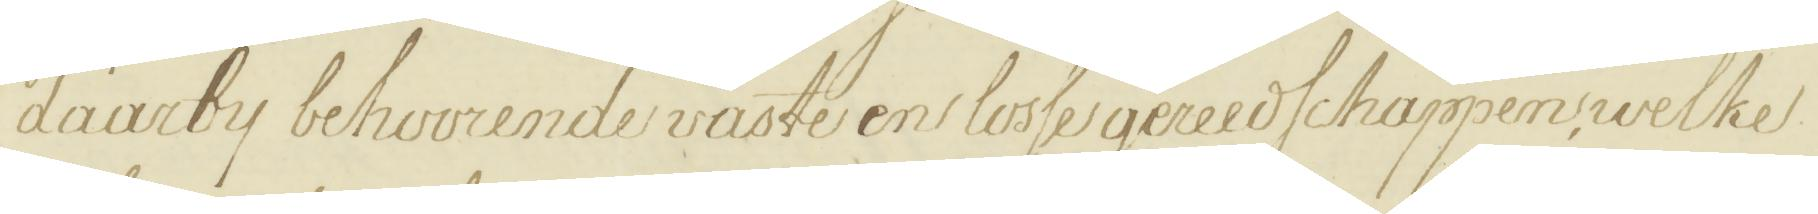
daarby behoorende vaste en losse gereedschappen, welke
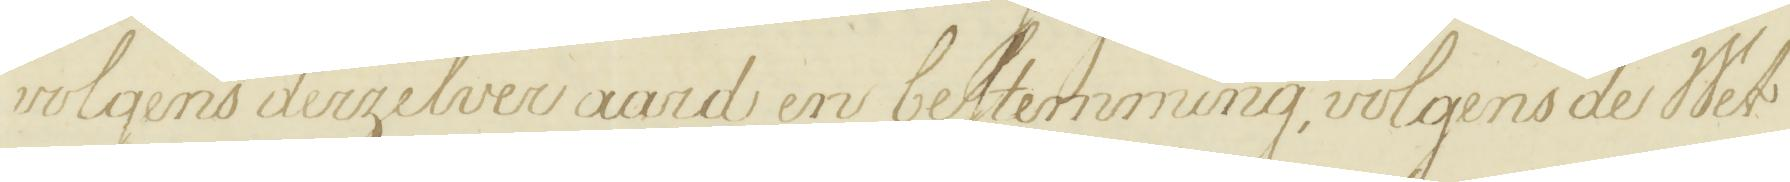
volgens derzelver aard en bestemming volgens de Wet
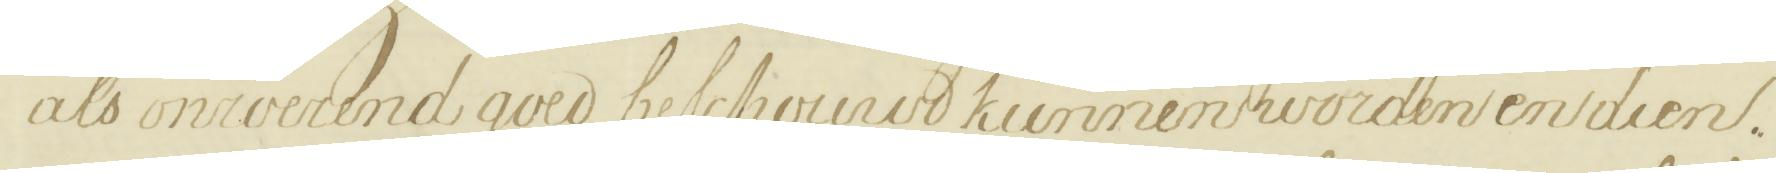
als onroerend goed beschouwd kunnen worden en dien„
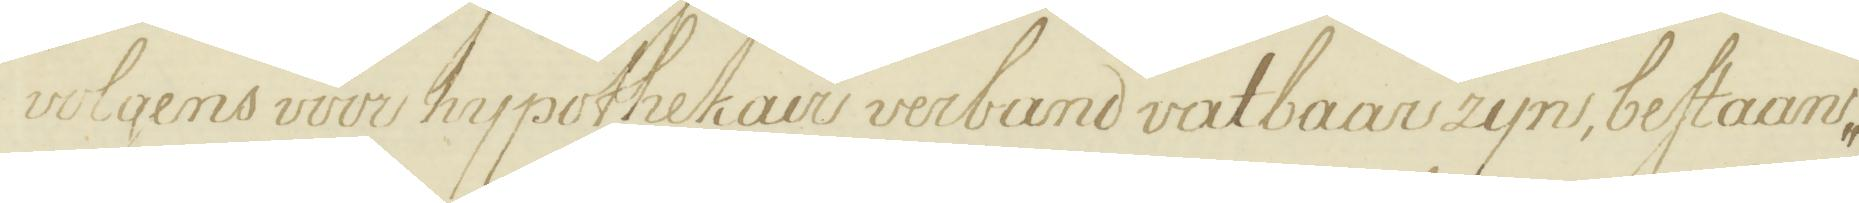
volgens voor hypothekair verband vatbaar zyn, bestaan„
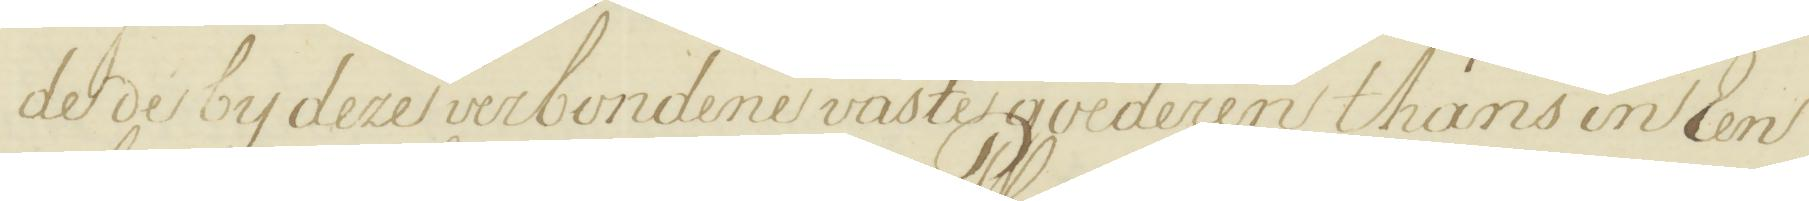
de de by deze verbondene vaste goederen thans in Een
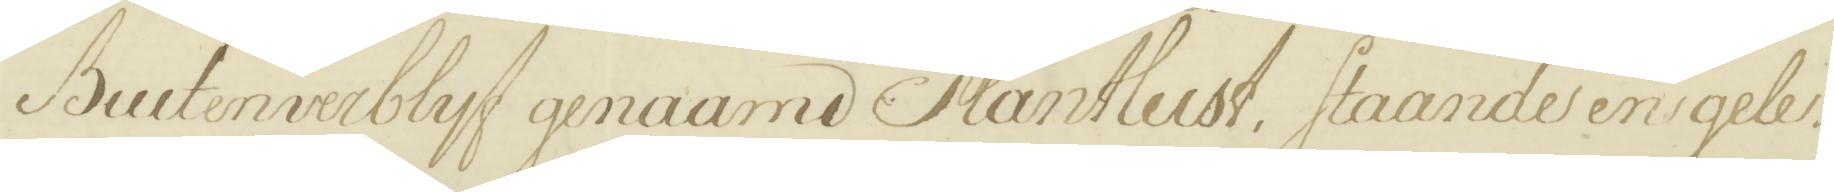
Buitenverblyf genaamd Plantlust, staande en gele„
